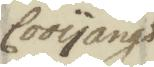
Cooijangs
